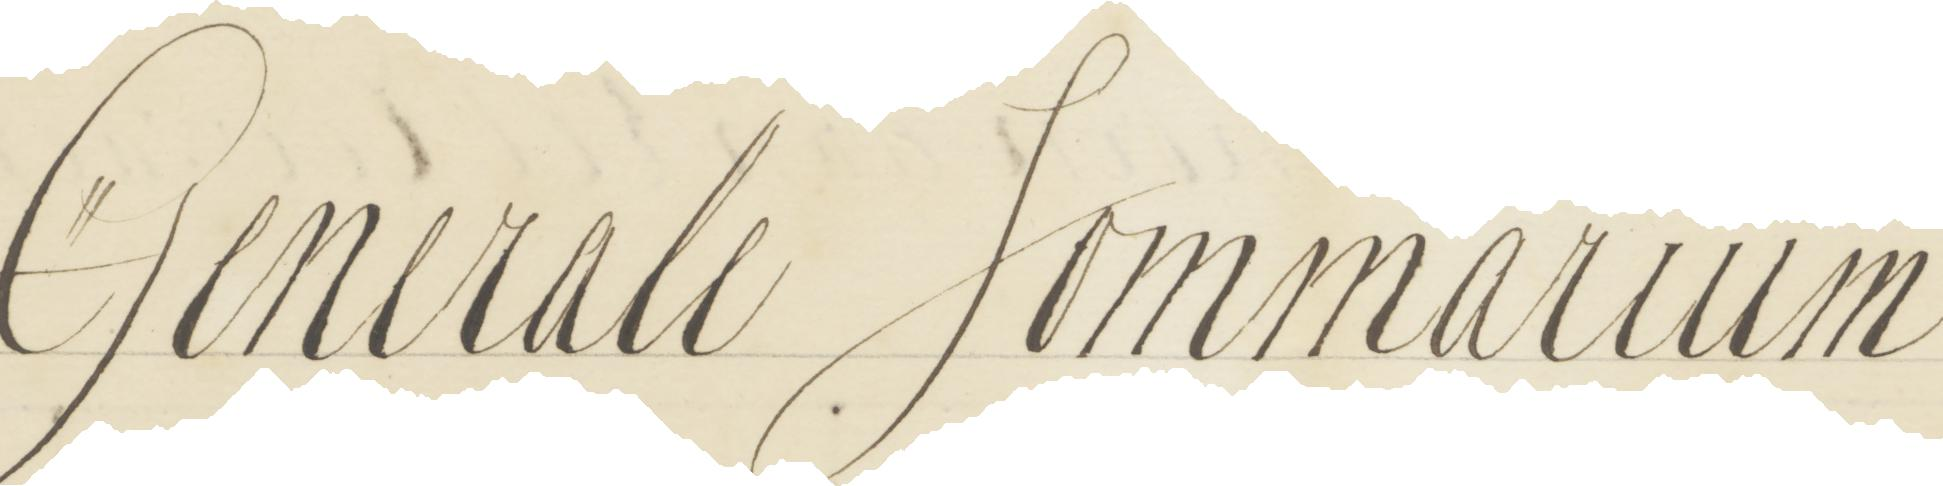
Generale Sommarium
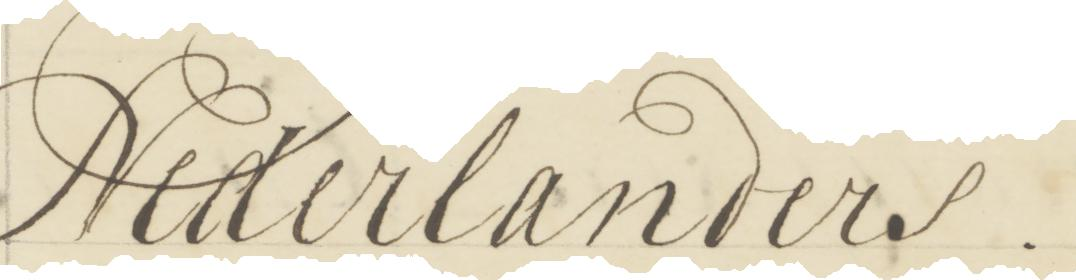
Nederlanders
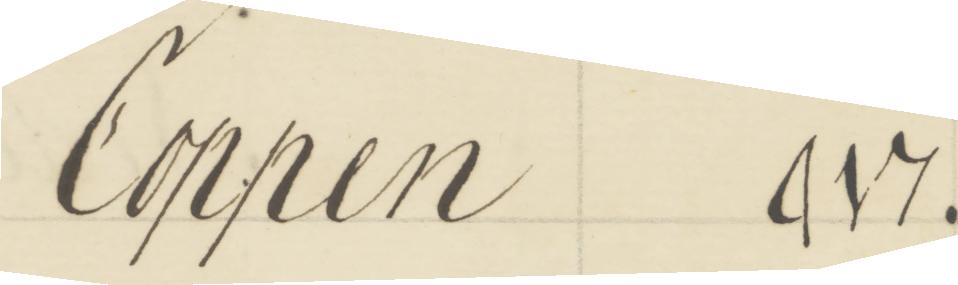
Coppen 417.
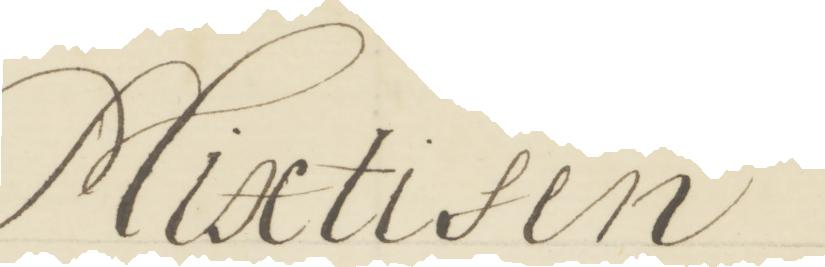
Mixtisen
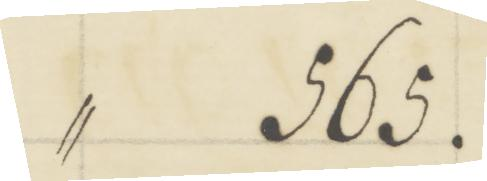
„ 565.
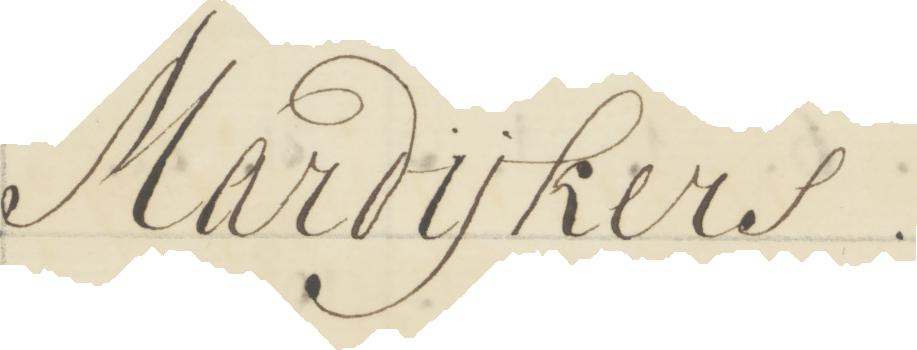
Mardijkers
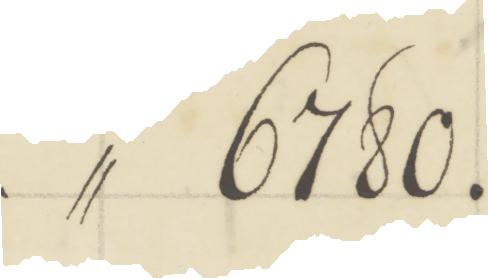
„ 6780.
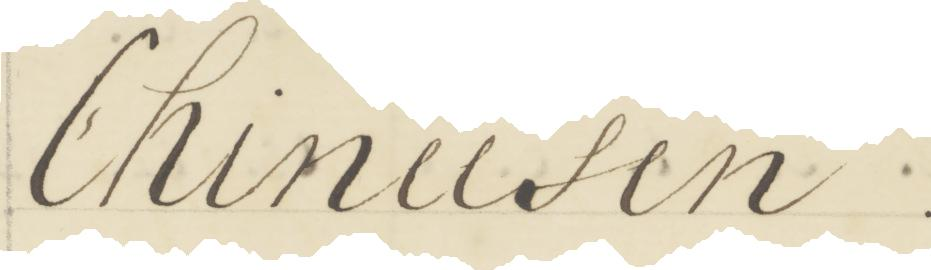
Chineesen.
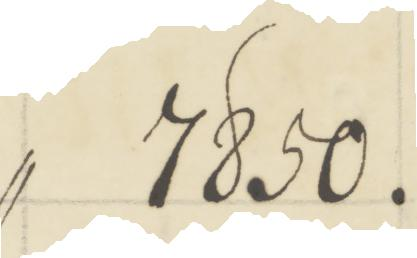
„ 7850.
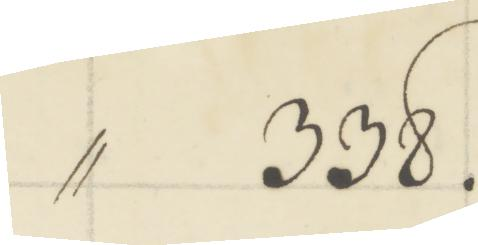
„ 338.
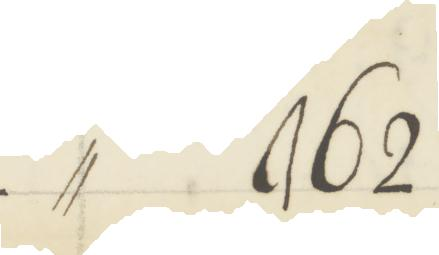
„ 462.
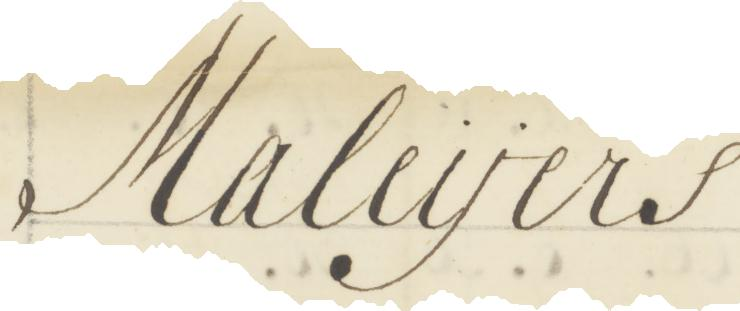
Maleijers
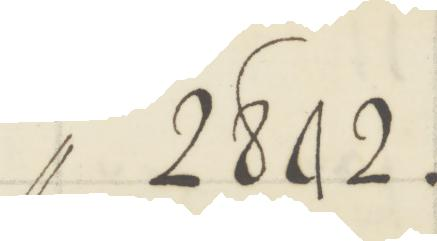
„ 2842.
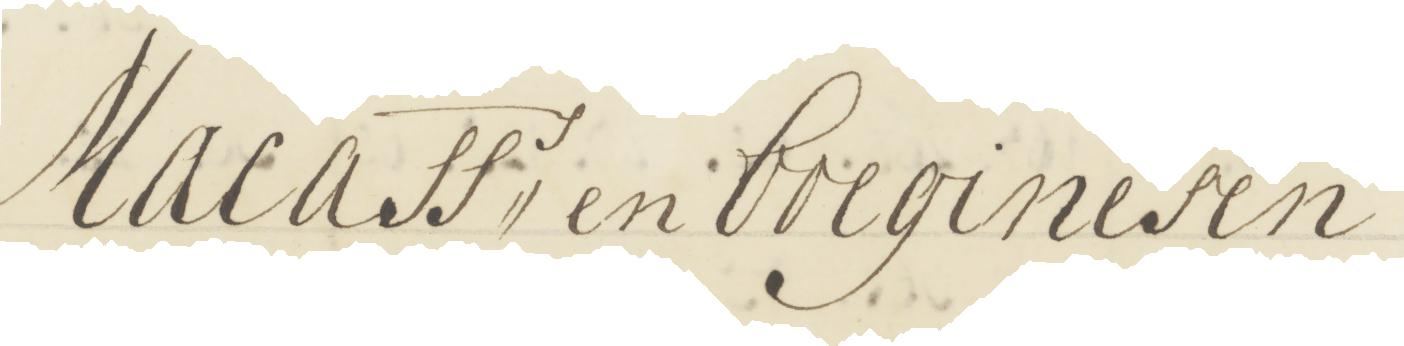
Macass„s en boeginesen
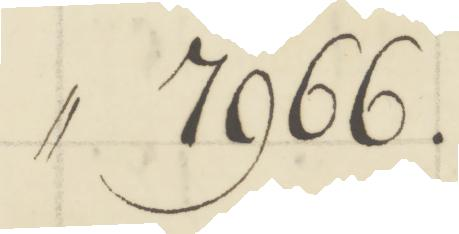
„ 7966.
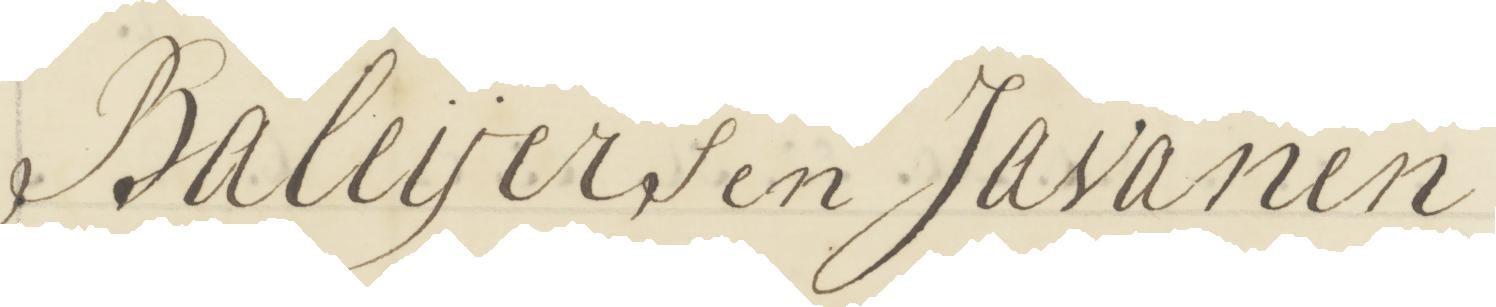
Baleijers en Javanen
